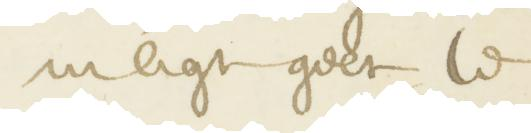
in ligt gelt te
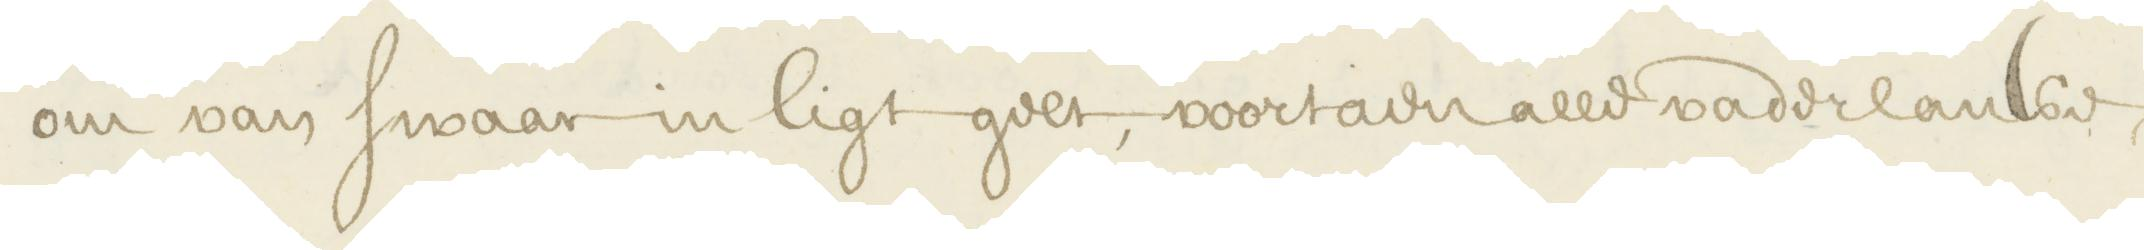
om van swaar in ligt gelt, voortaen alle vaderlantse
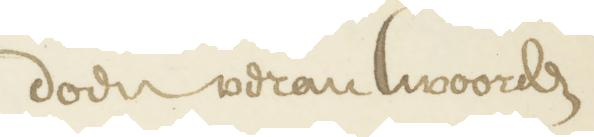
doen verantwoorden
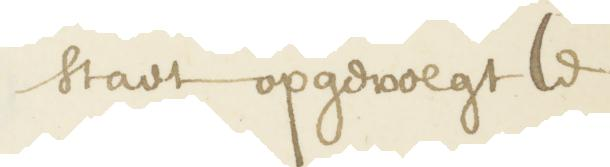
staet opgevolgt te
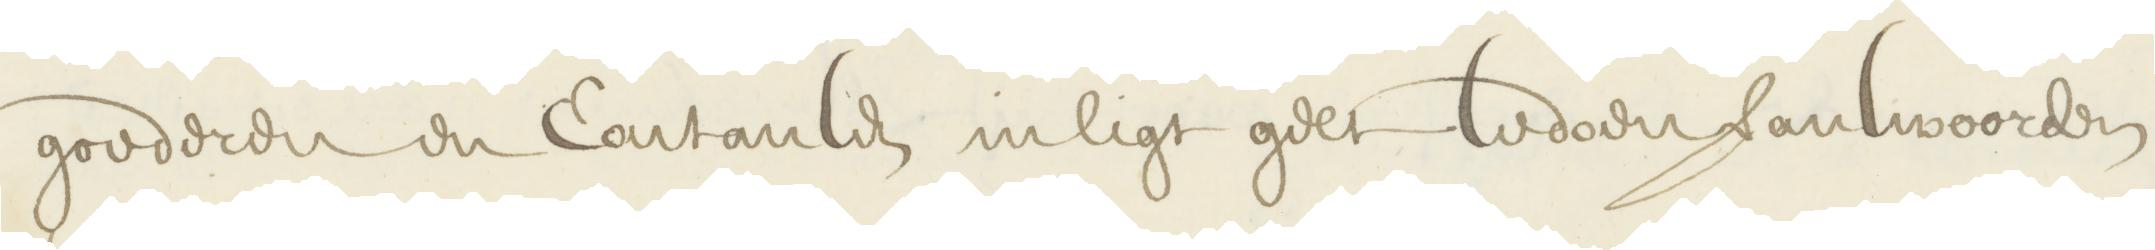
goederen en Contanten in ligt gelt te doen verantwoorden
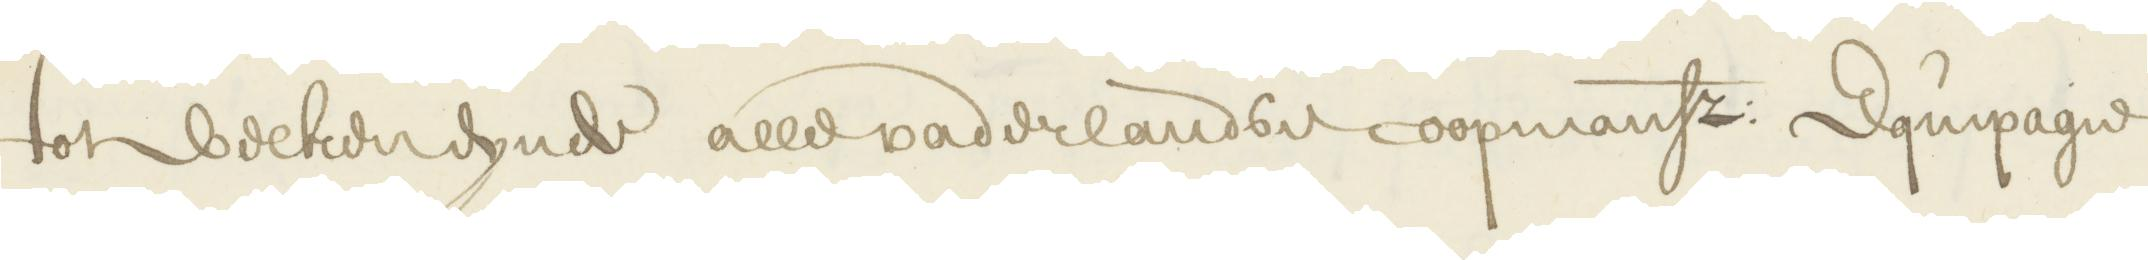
tot welken eynde alle vaderlandse coopmansz: Equipagie
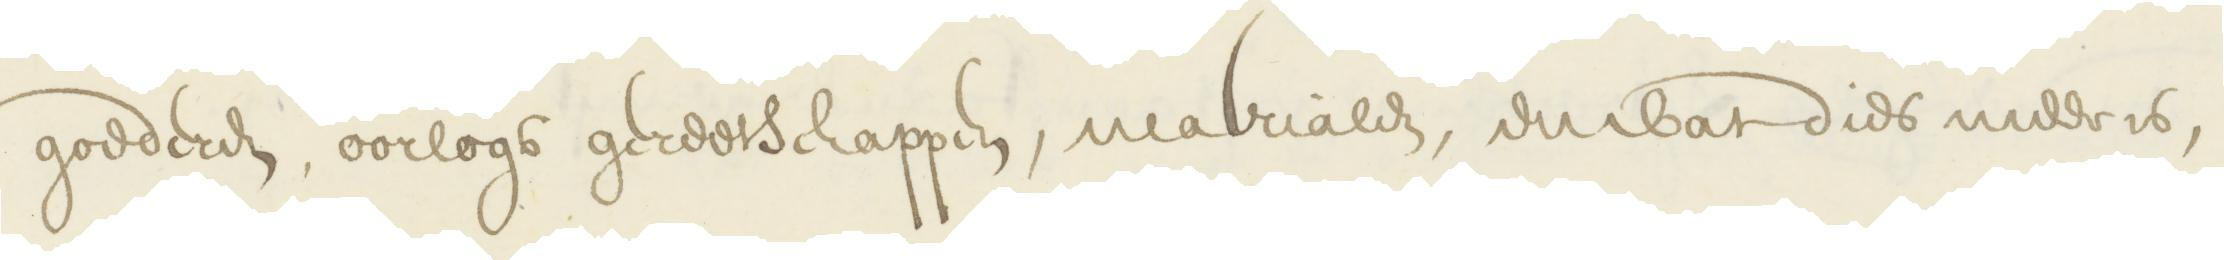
goederen, oorlogs gereetschappen, matrialen, en wat dies meer is,
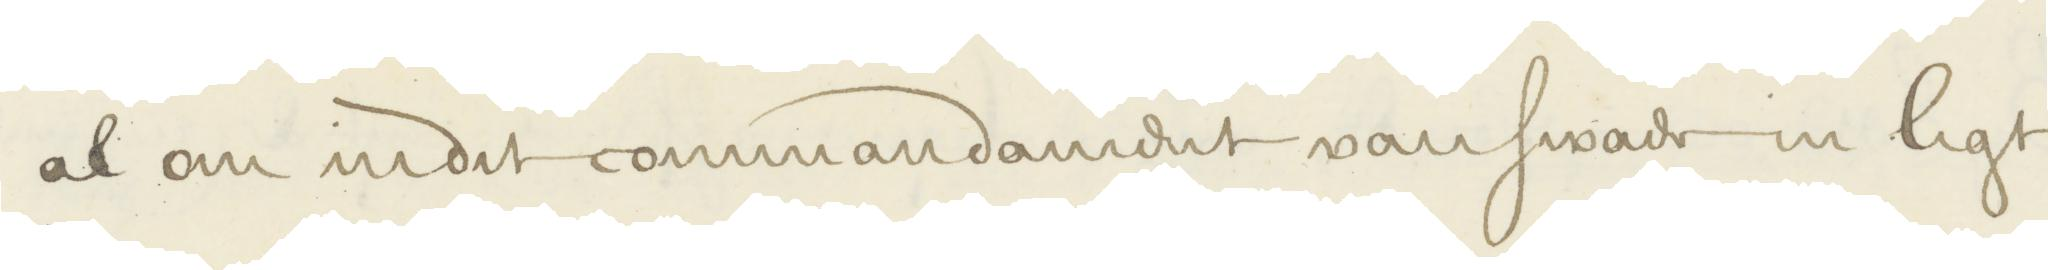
al om in dit commandament van swaer in ligt
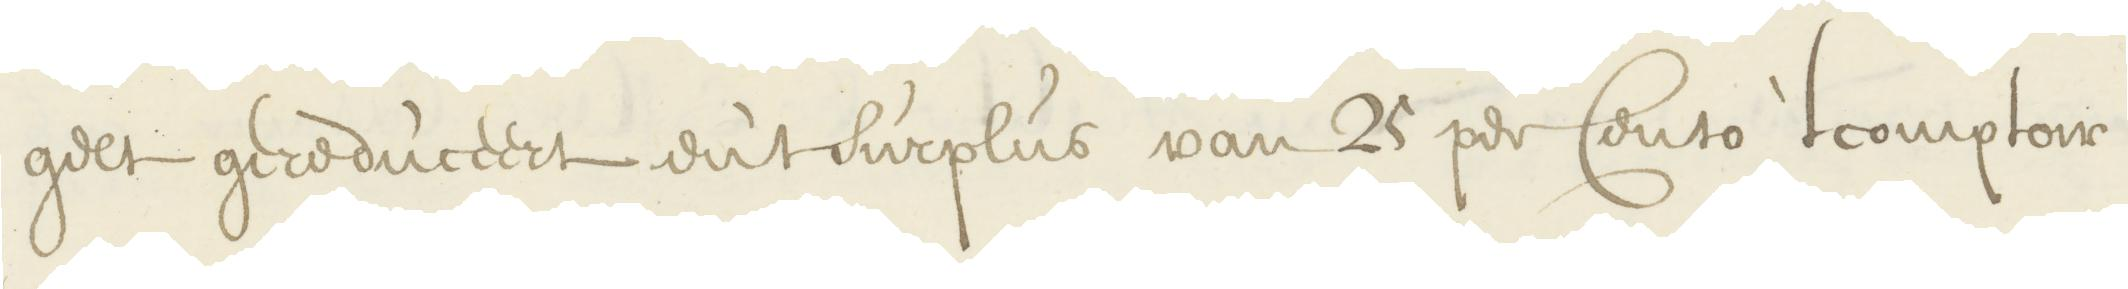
gelt gereduceert en’t surplus van 25 per Cento 'tcomptoir
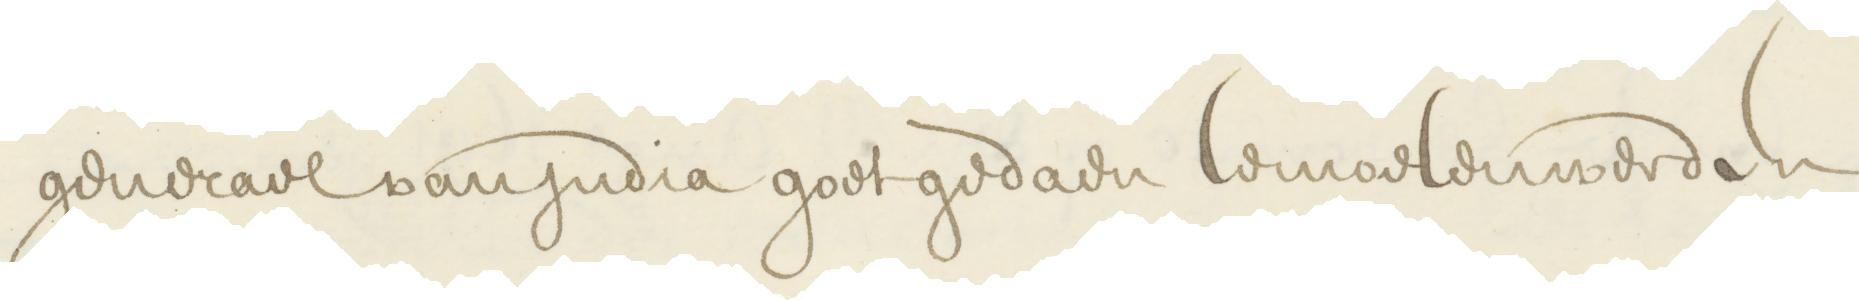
generael van jndia goet gedaen temoetenwerden
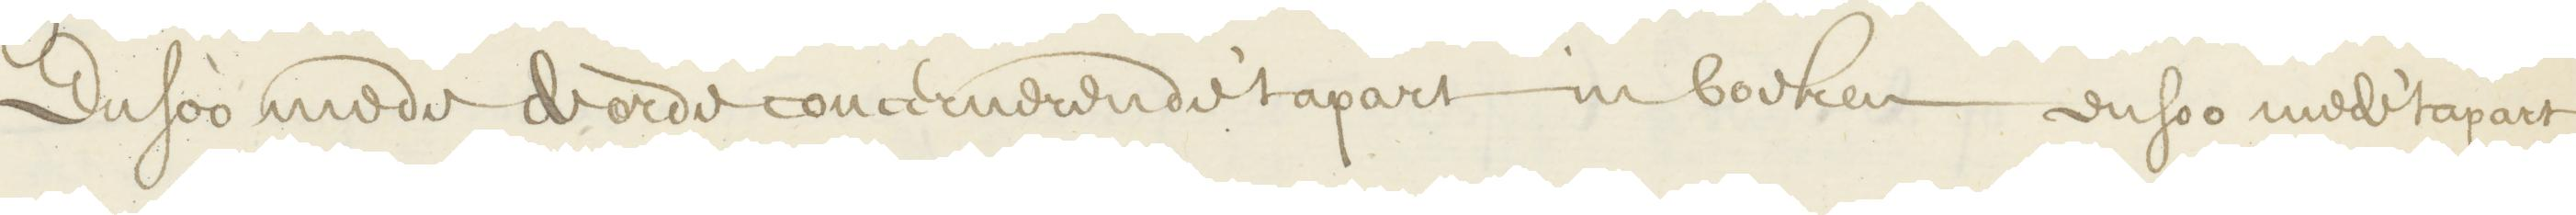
Ensoo mede deorde concernerende 'tapart in boeken en soo mede tapart
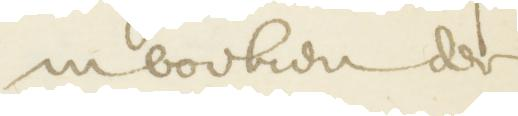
in boeken der
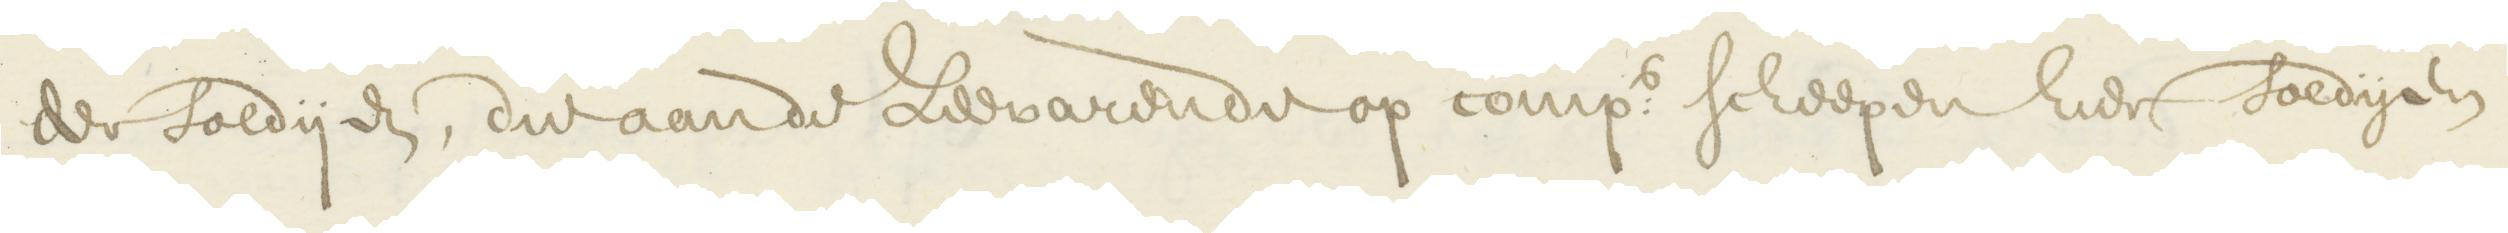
der soldij en, die aan de Zeevarende op comp:s scheepen hier soldijen
